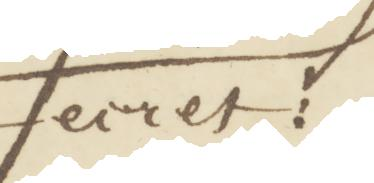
Secret:
